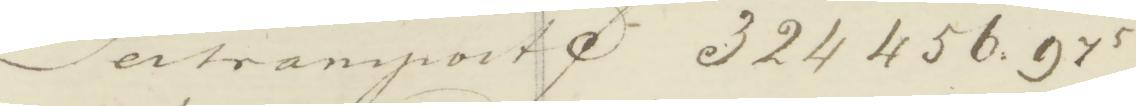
Per transport ƒ 324456: 975
